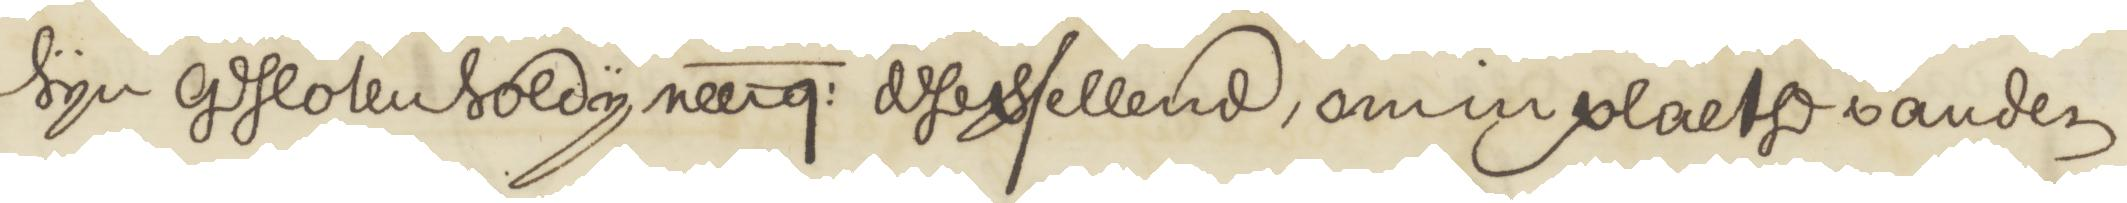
sijn geslotensoldij reecq: deseversellend, om in plaetse vanden
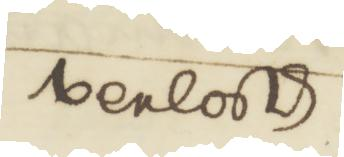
verlosten
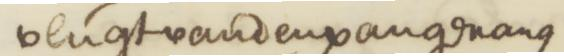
vlugt vanden pangerang
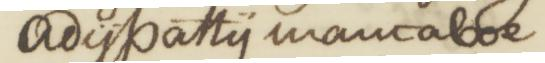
Adijpattij mancaboe
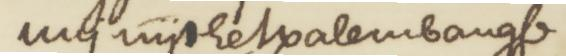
mij uijt hetpalembangse
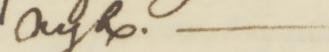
ryk. —
